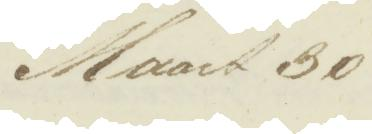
Maart 30
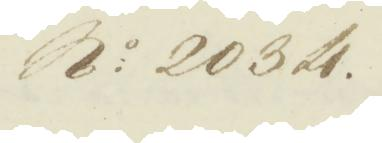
N:o 2034.
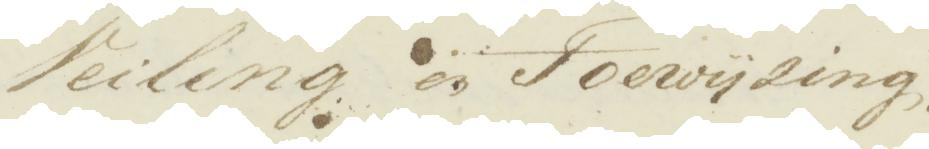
Veiling, en Toewijzing
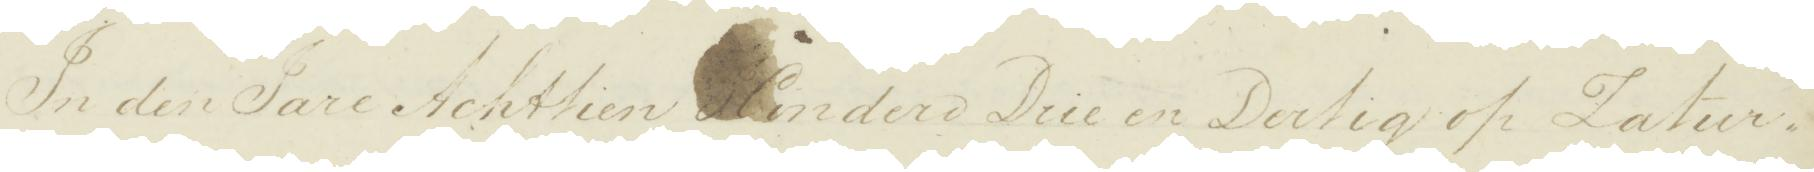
In den Jare Achttien Honderd Drie en Dertig op Zatur„
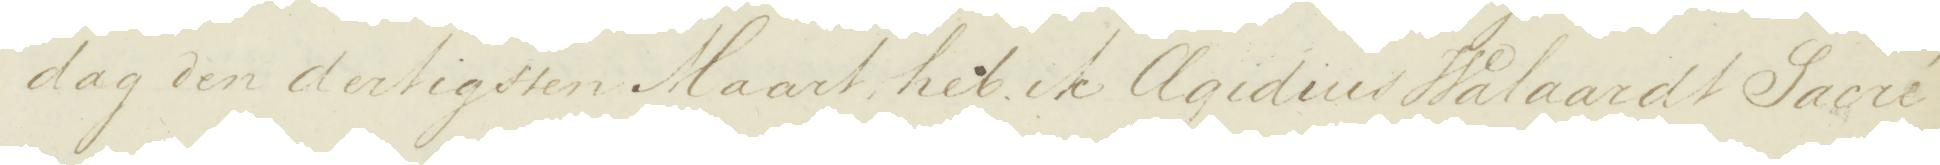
dag den dertigsten Maart, heb ik AEgidius Walaardt Sacré
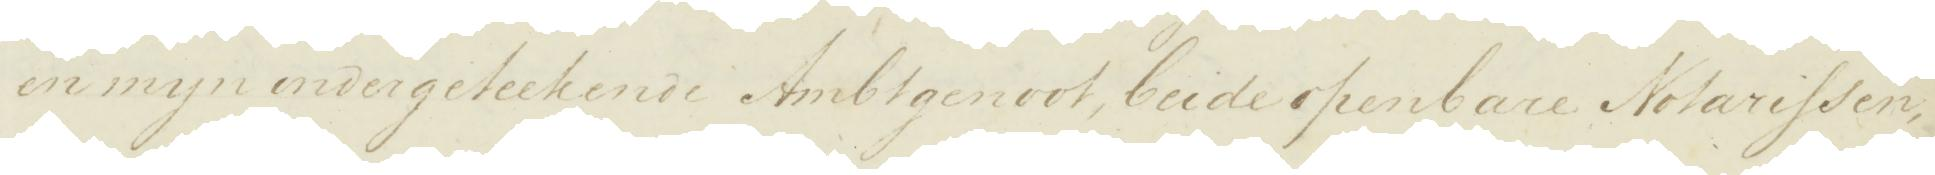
en myn ondergeteekende Ambtgenoot, beide openbare Notarissen„
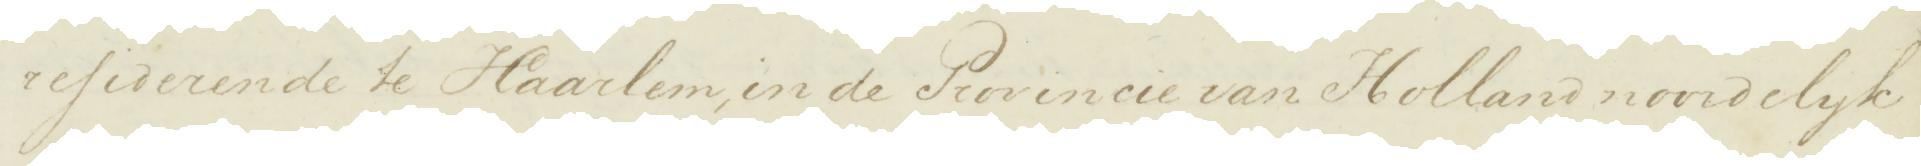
residerende te Haarlem, in de Provincie van Holland noordelyk
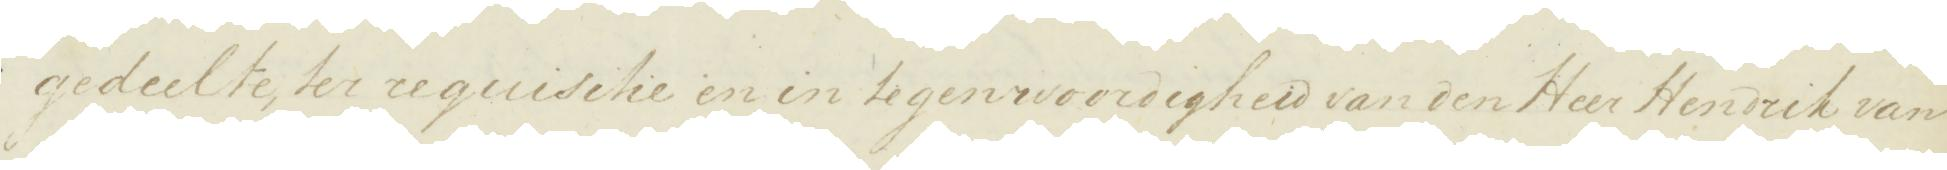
gedeelte, ter requisitie en in tegenwoordigheid van den Heer Hendrik van
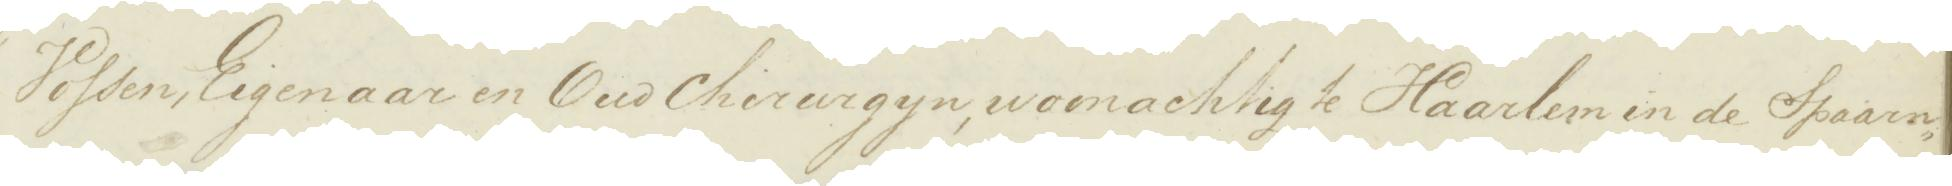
Vossen, Eigenaar en Oud Chirurgyn, woonachtig te Haarlem in de Spaarne
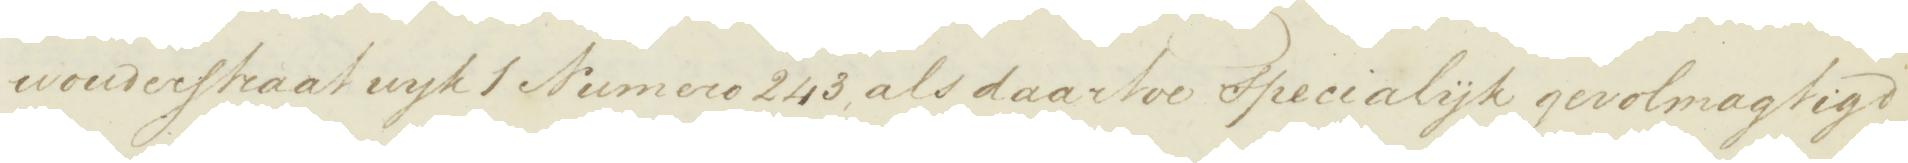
wouderstraat wyk 1 Numero 243, als daartoe specialijk gevolmagtigd
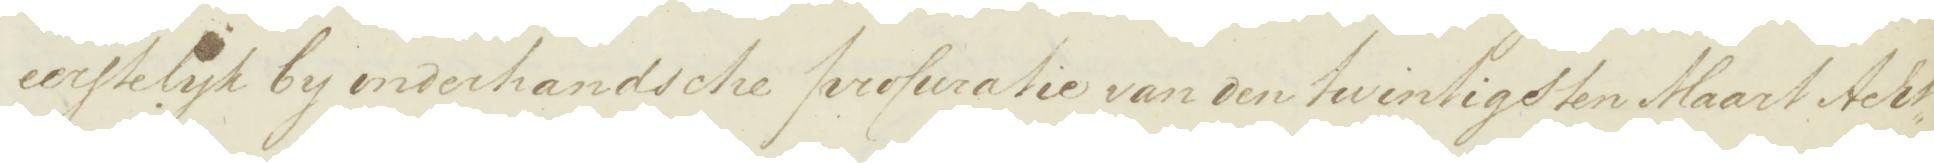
eerstelyk by onderhandsche procuratie van den twintigsten Maart Acht„
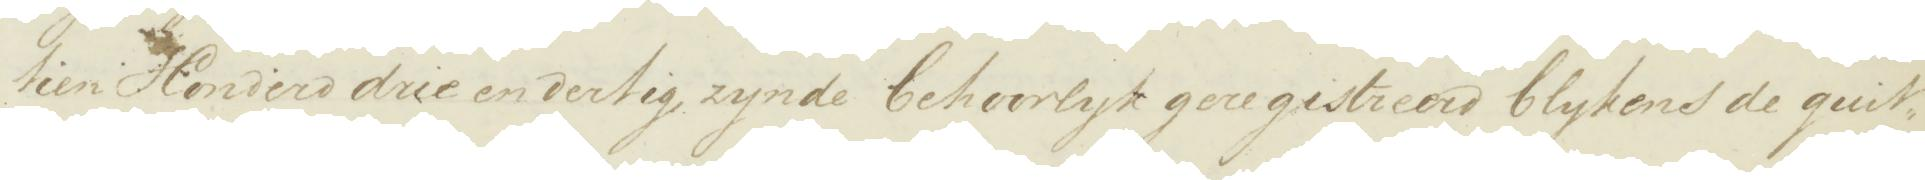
tien Honderd drie en dertig, zynde behoorlyk geregistreerd blykens de quit„
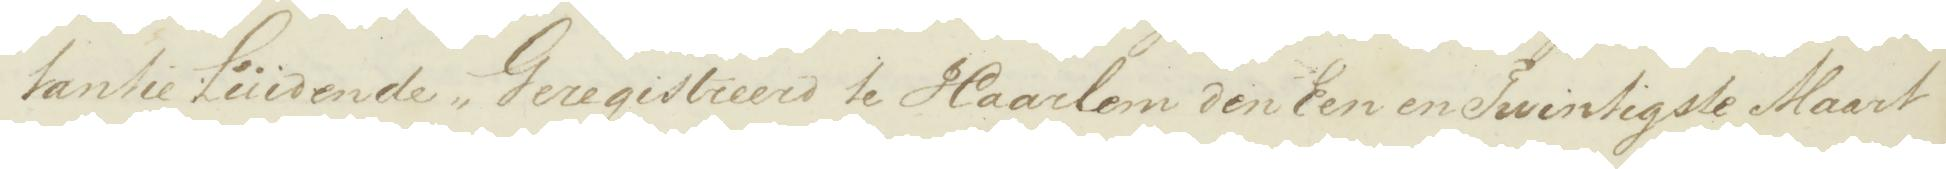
tantie luidende „ Geregistreerd te Haarlem den Een en Twintigste Maart
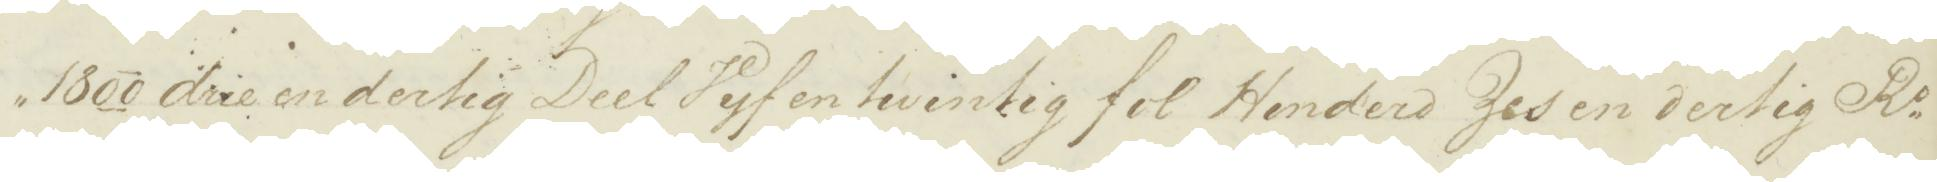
„ 1800 drie en dertig Deel Vyf en twintig fol Honderd Zes en dertig R„o
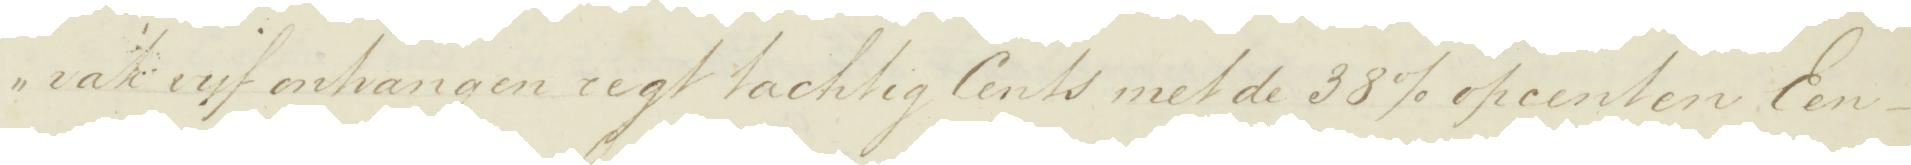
„ vak vyf ontvangen regt tachtig Cents met de 38% opcenten Een-
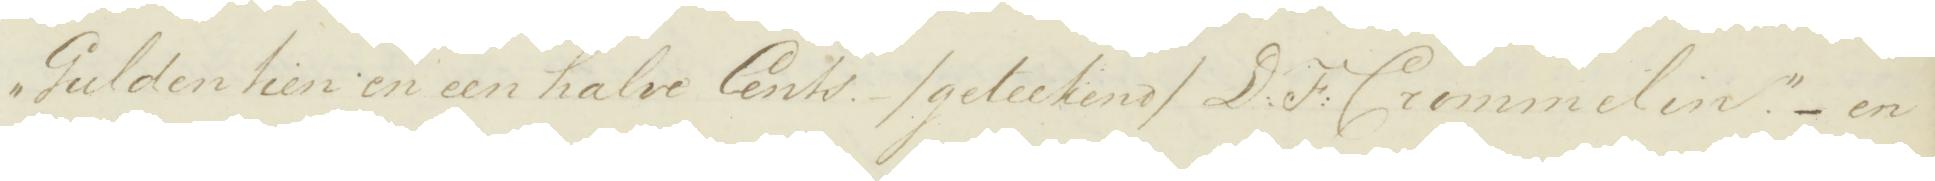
„Gulden tien en een halve Cents. - / geteekend/ D: F: Crommelin." - en
